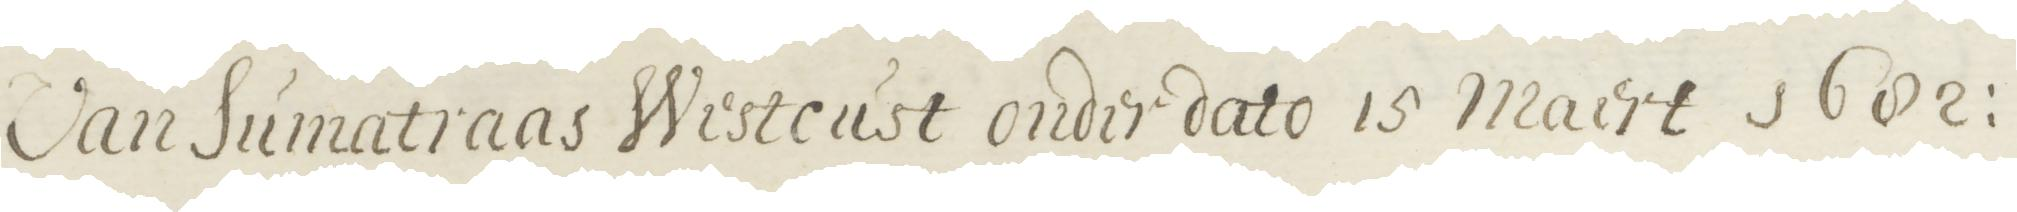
Van Sumatraas Westcust onder dato 15 Maert 1682:
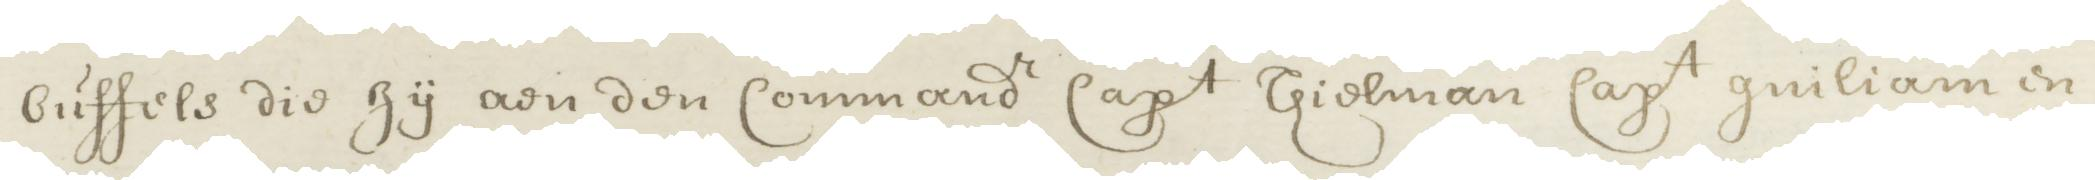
buffels die hij aen den Commandr Capt Tielman Capt guiliam en
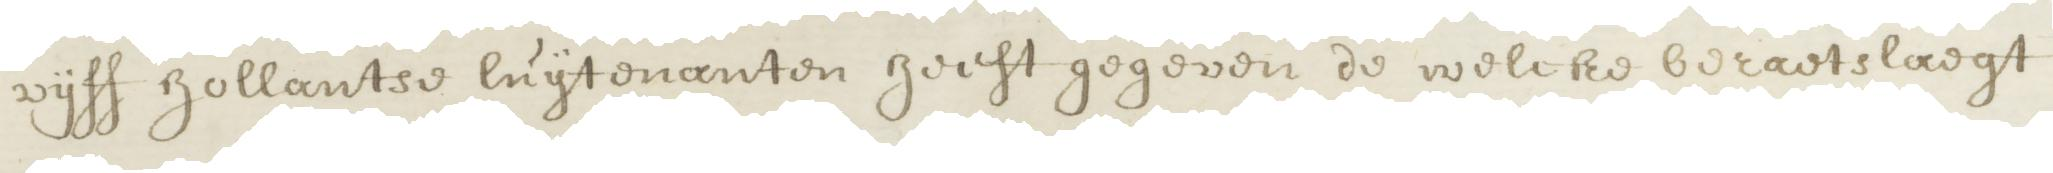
vijff hollantse luijtenanten heeft gegeven de welcke beraetslaegt
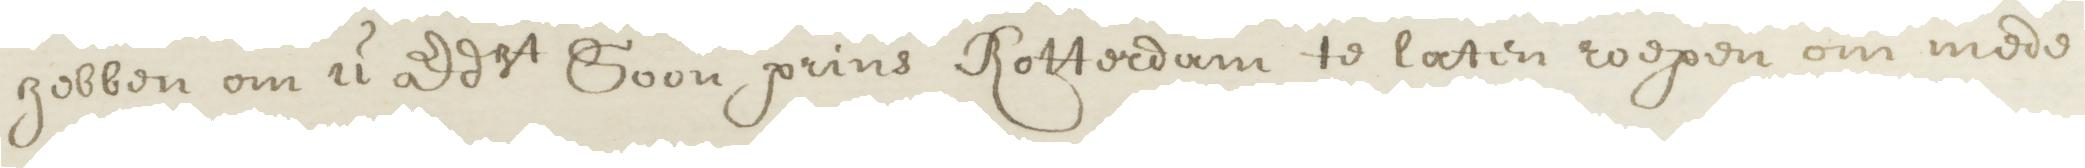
hebben om u Edht Soon prins Rotterdam te laten roepen om mede
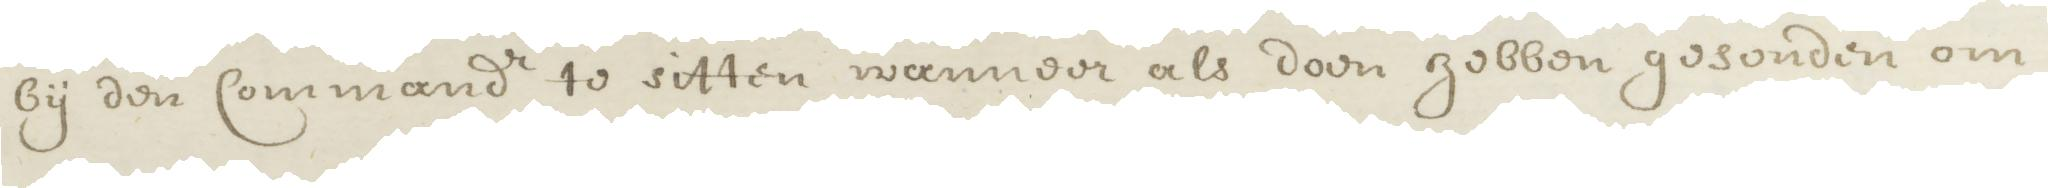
bij den commandr te sitten wanneer als doen hebben gesonden om
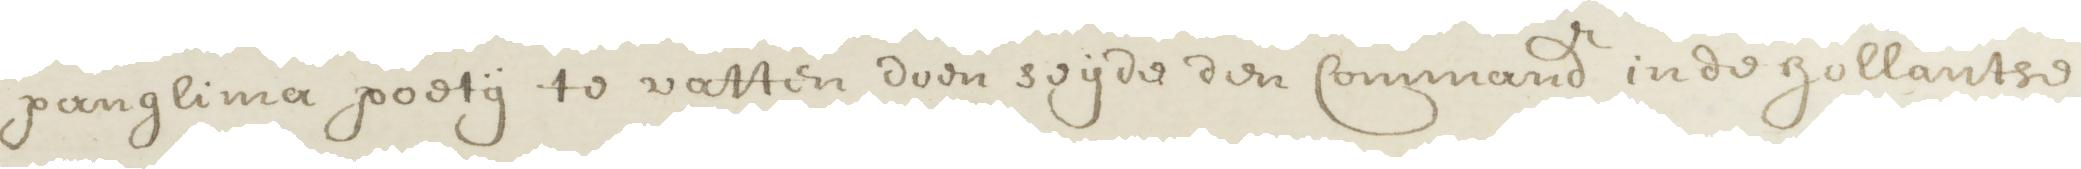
panglima poetij te vatten doen seijde den commandr in de hollantse
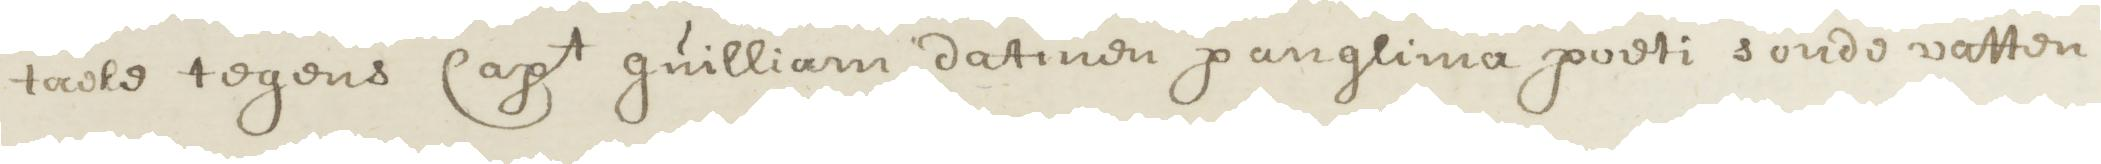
taele tegens capt guilliam datmen panglima poeti soude vatten
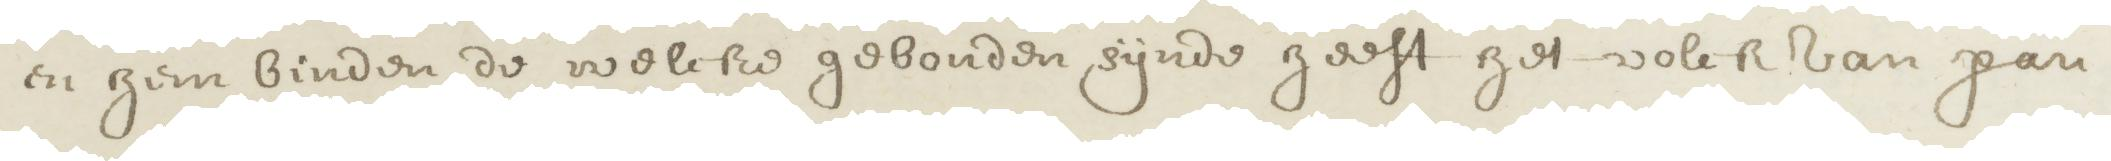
en hem binden de welcke gebonden sijnde heeft het volck van pan
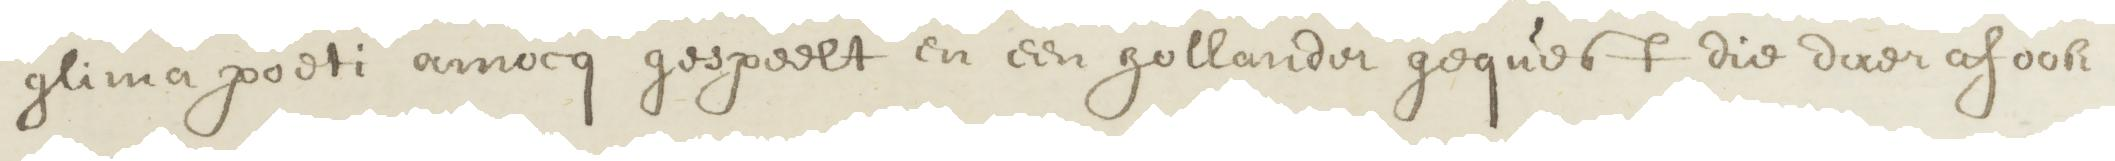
glima poeti amocq gespeelt en een hollander gequest die daer af ook
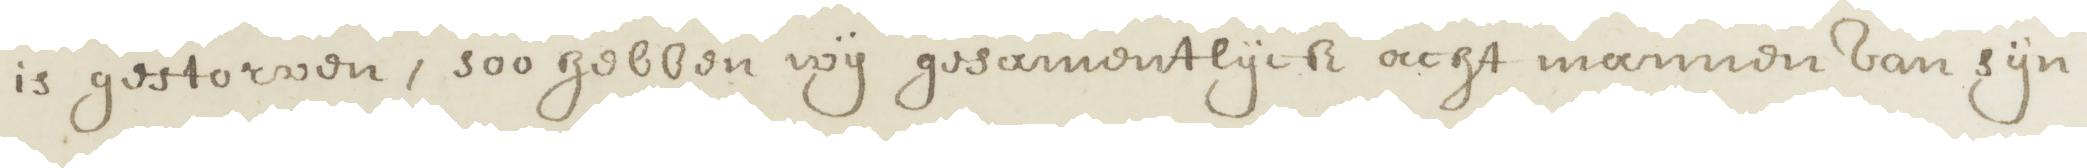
is gestorven, soo hebben wij gesamentlijck acht mannen van sijn
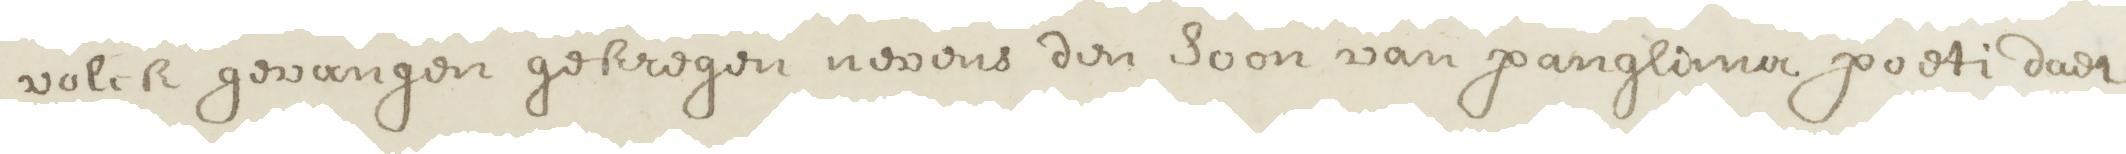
volck gevangen gekregen nevens den soon van panglima poeti daet
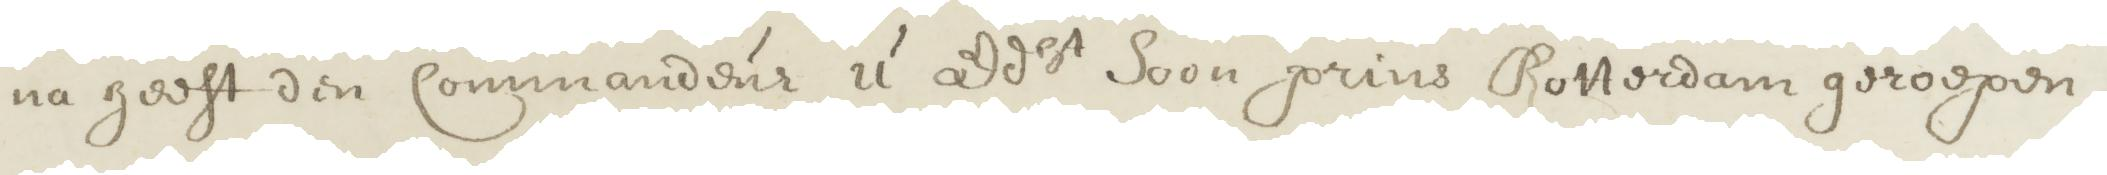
na heeft den Commandeur u Edht soon prins Rotterdam geroepen
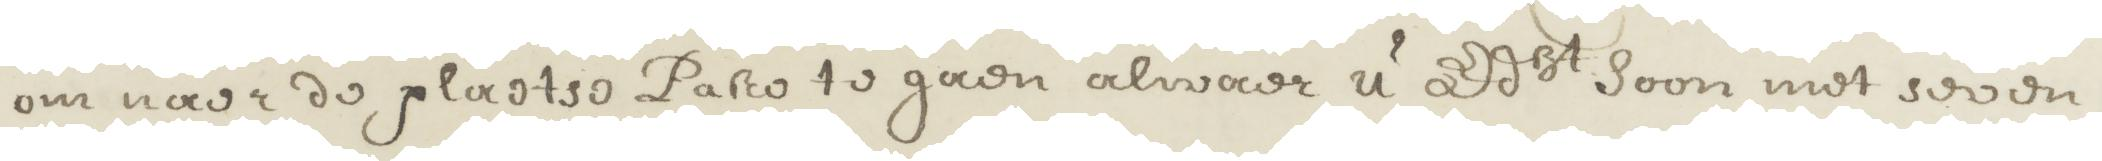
om naer de plastso Pako te gaen alwaer u Edht soon met seven
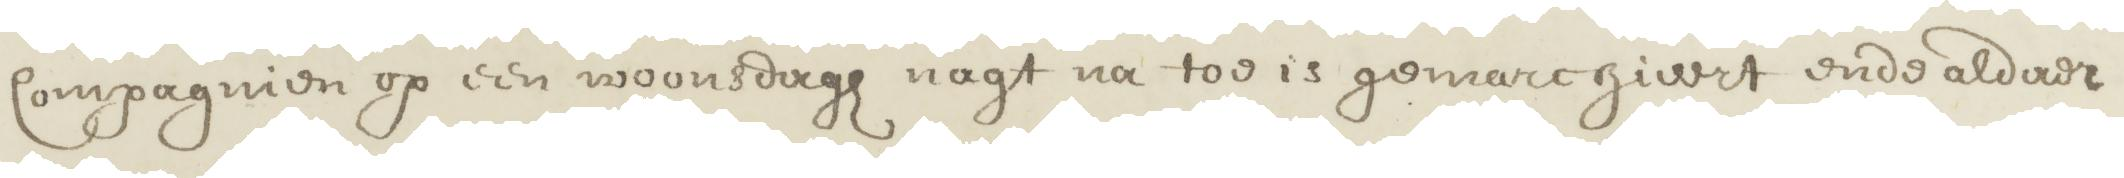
compagnien op een woonsdagh nagt na toe is gemarchieert ende aldaer
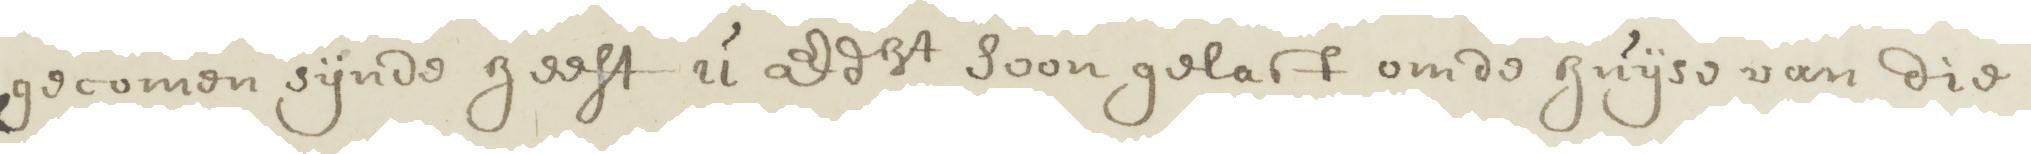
gecomen sijnde geeft u Edht soon gelast omde huijse van die
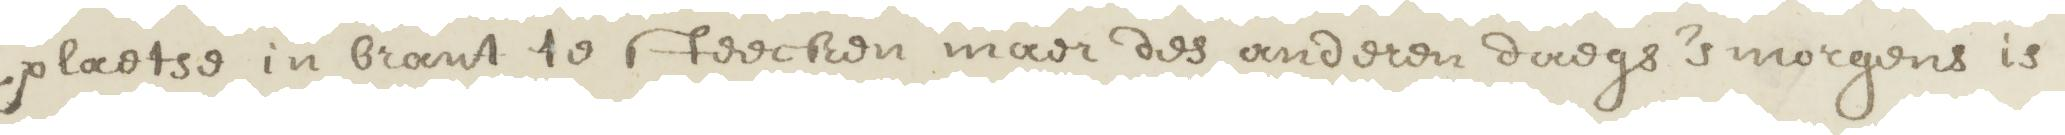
plaetse in brant te steecken maer des anderen daegs ’s morgens is
